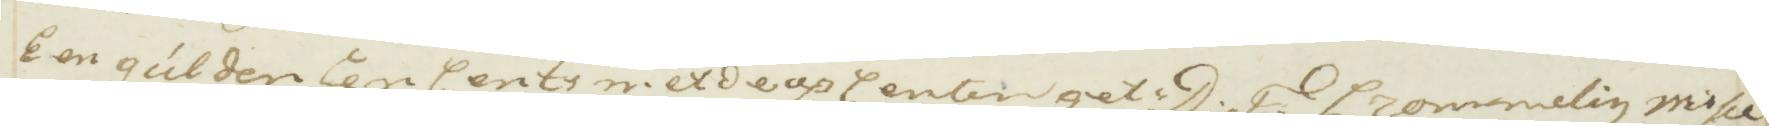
Een gulden Een Cents met de opcenten get: DF Crommelin wissel
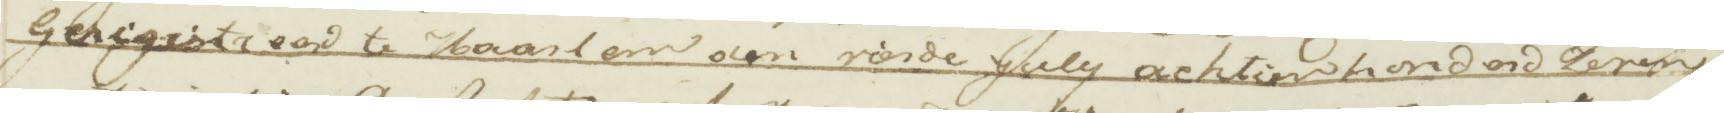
Gerigistreerd te Haarlem den vierde July achtien honderd zeven
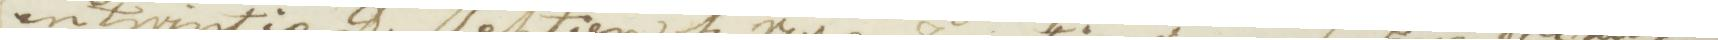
en twintig D. Achtien fo vyf en zeventig v: vak Een ontvangen
